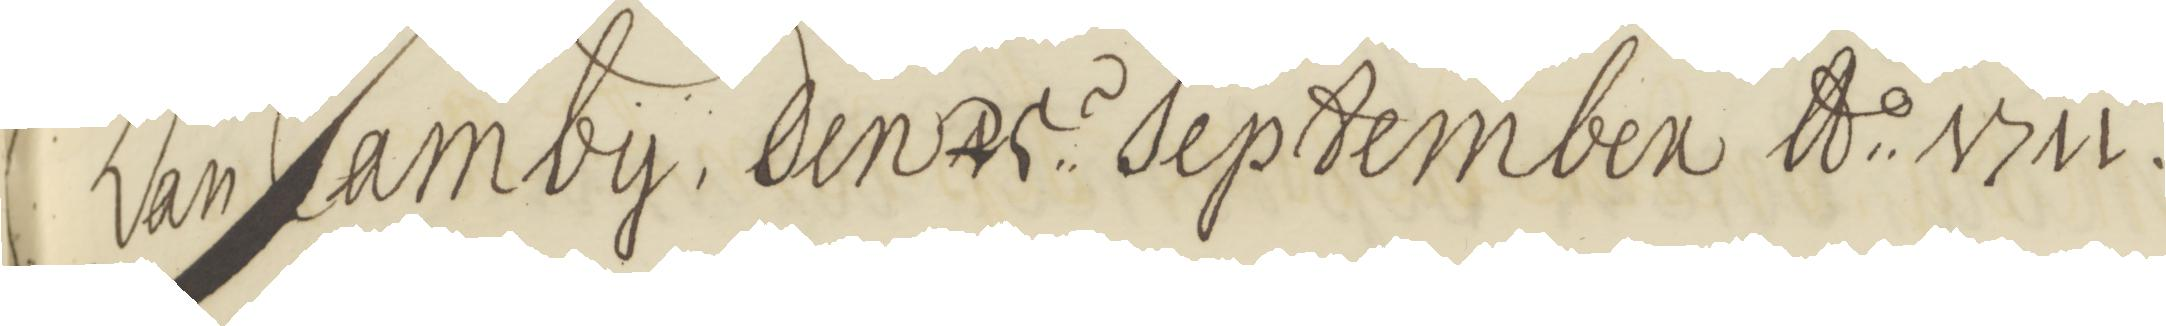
Van Jambij, den 25:' September A„o 1711.
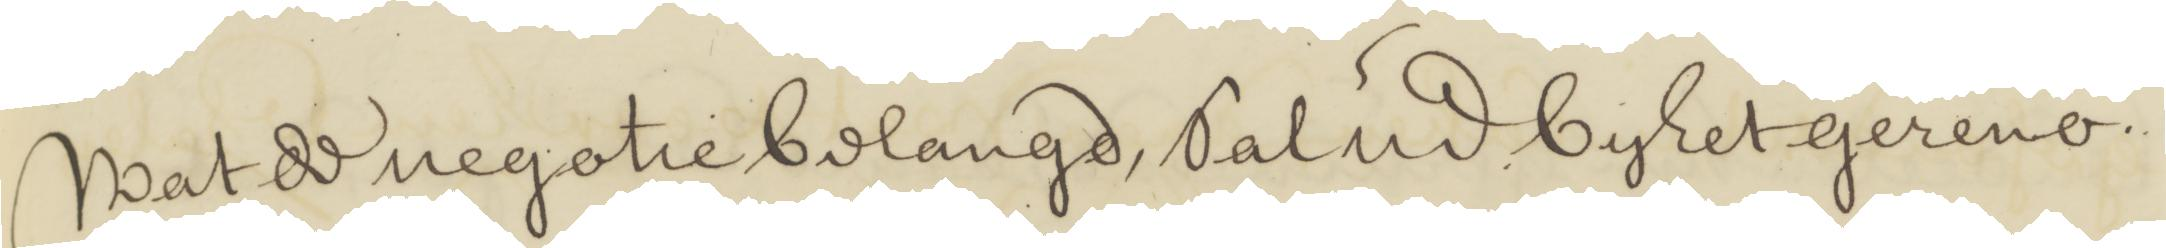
wat de negotie belangd, Sal uE by het gerene„
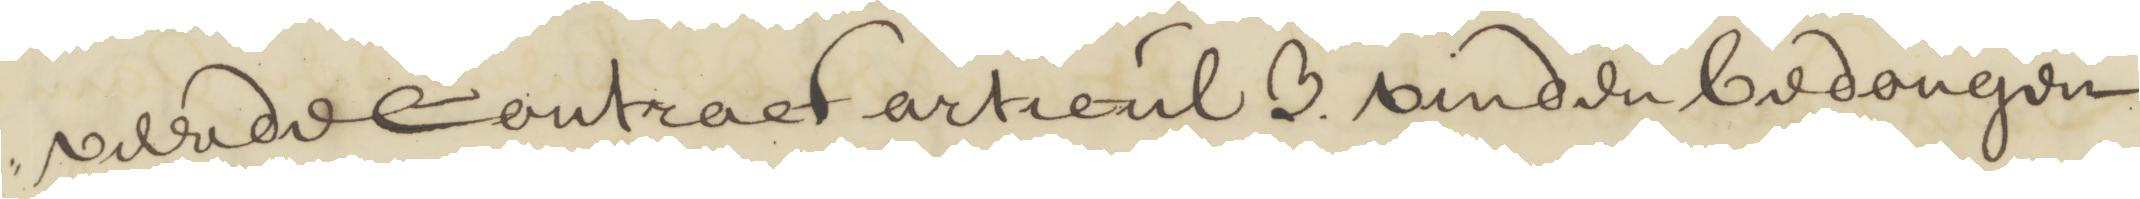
„veerde Contract articul 3. vinden bedongen
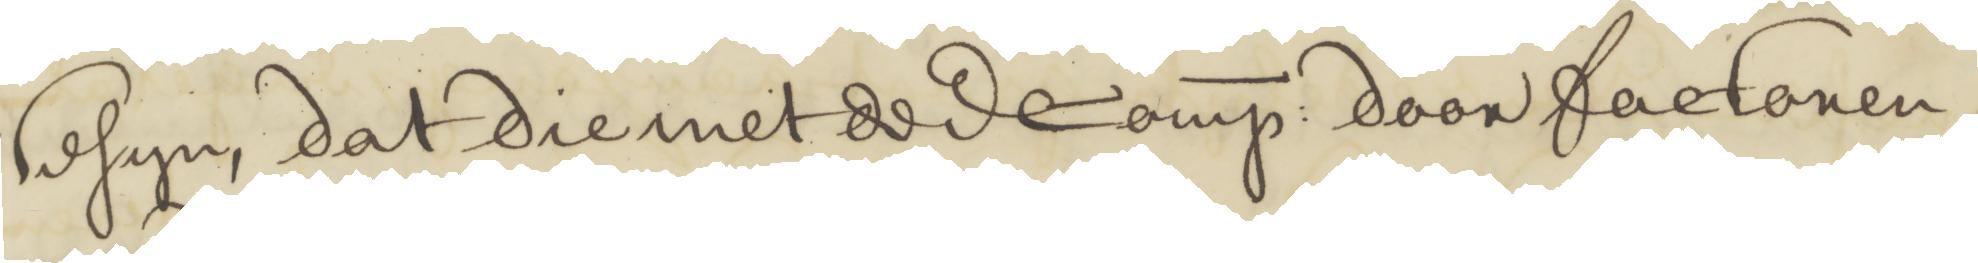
te syn, dat die met de EComp: door factoren
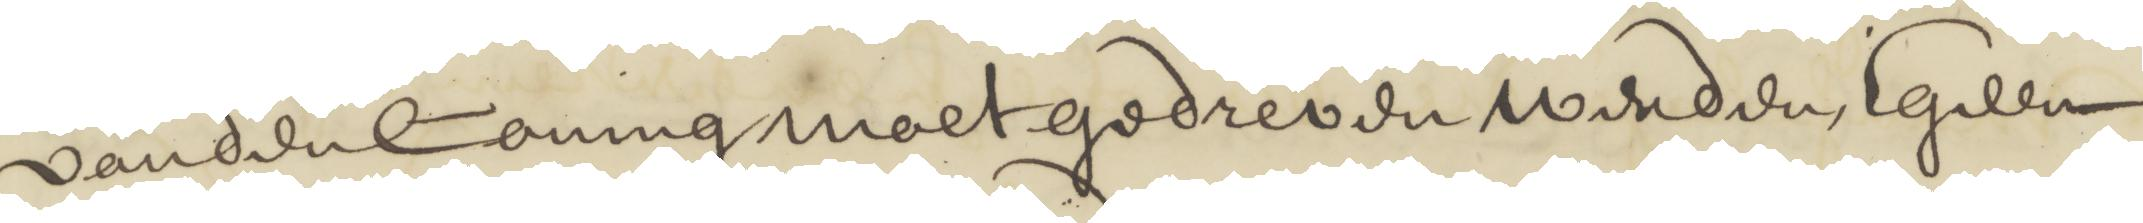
van den Coning moet gedreven werden, 't geen
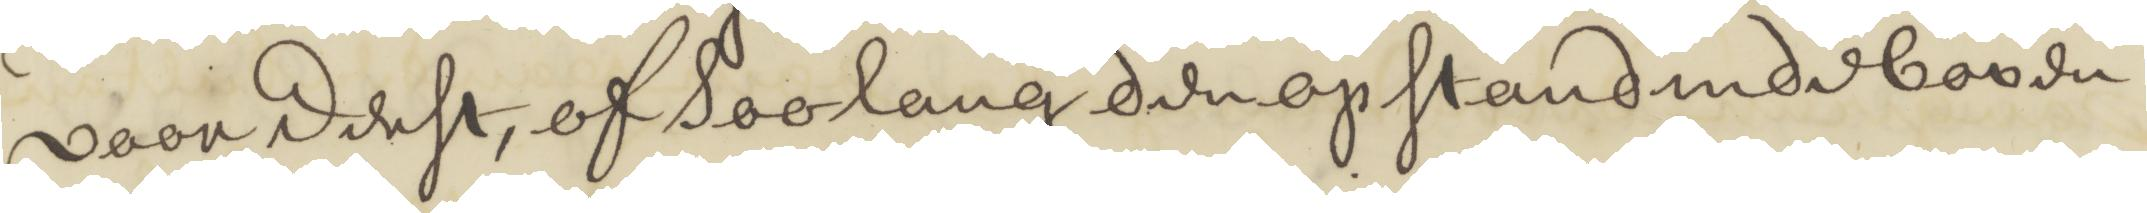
voor Eerst, of soolang den opstand in de boven
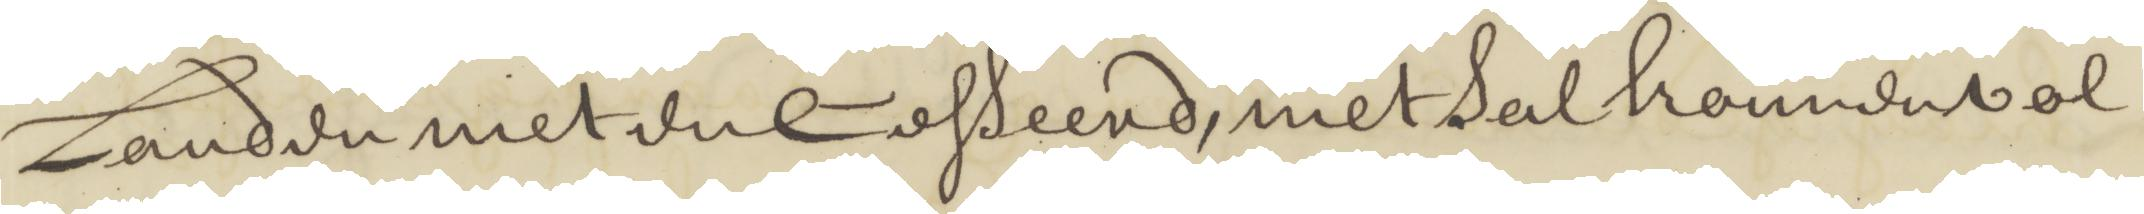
Landen niet en cesseerd, niet Sal konnen vol
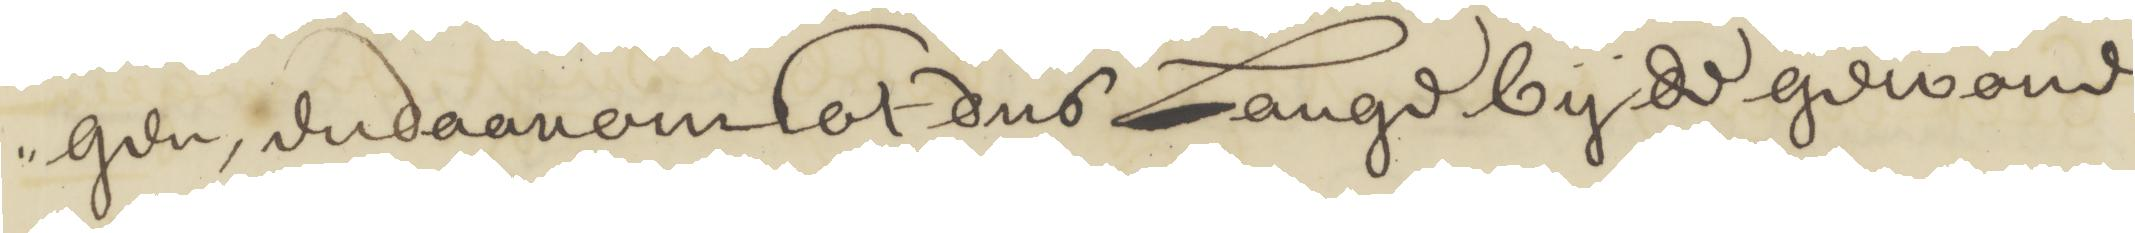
„gen, en daarom tot dus Lange bij de gewone
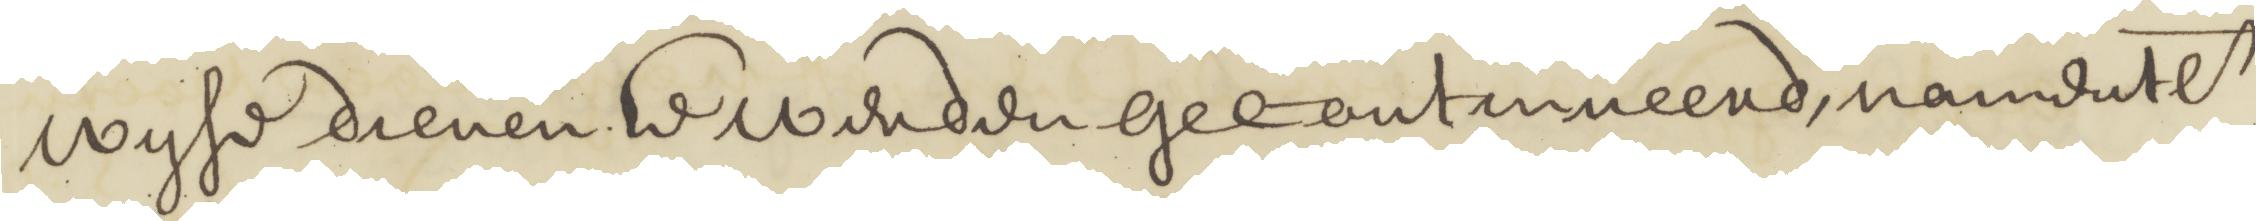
Wyse dienen te Werden gecontinueerd, namentlijk
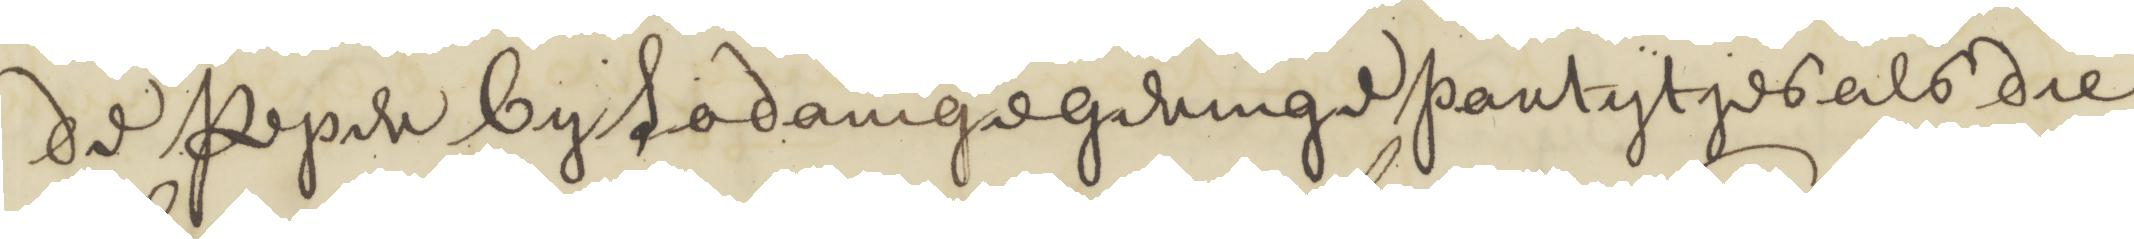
de Peper bij Sodanige geringe partijtjes als die
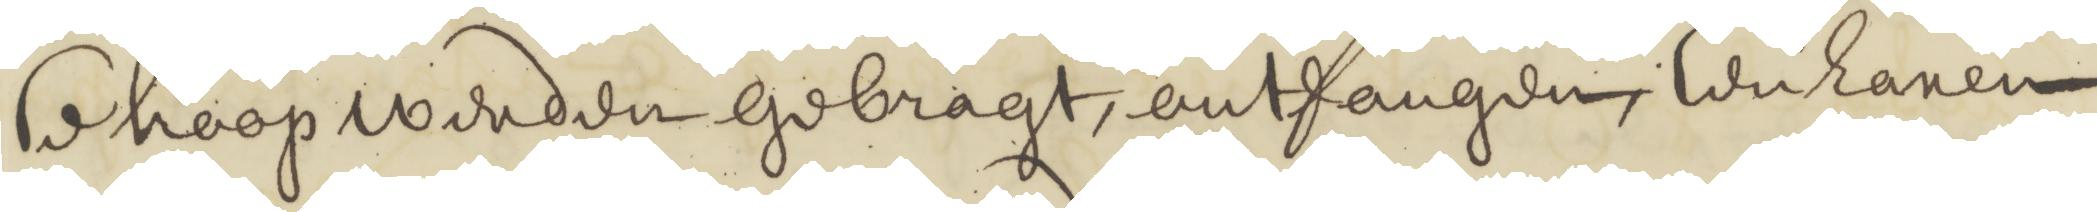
te koop werden gebragt, ontfangen, ten haren
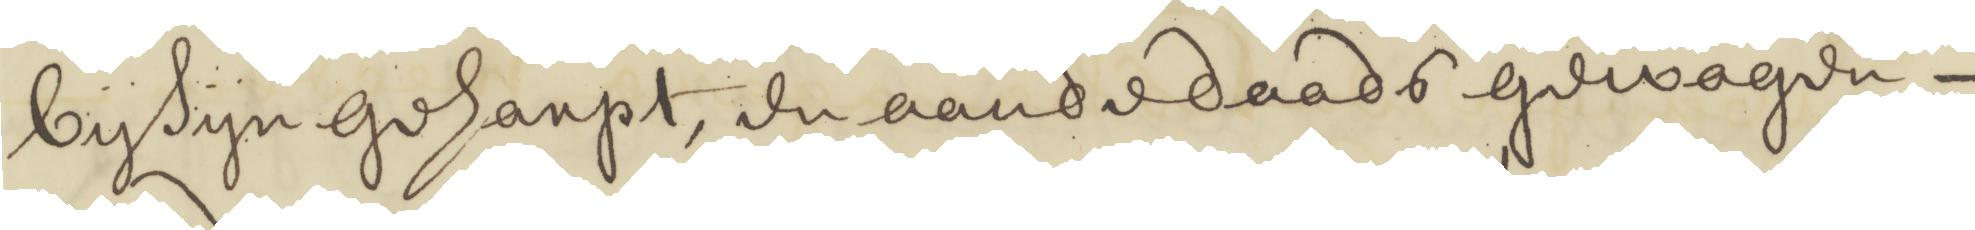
bij sijn geharpt, en aan de daads gewogen
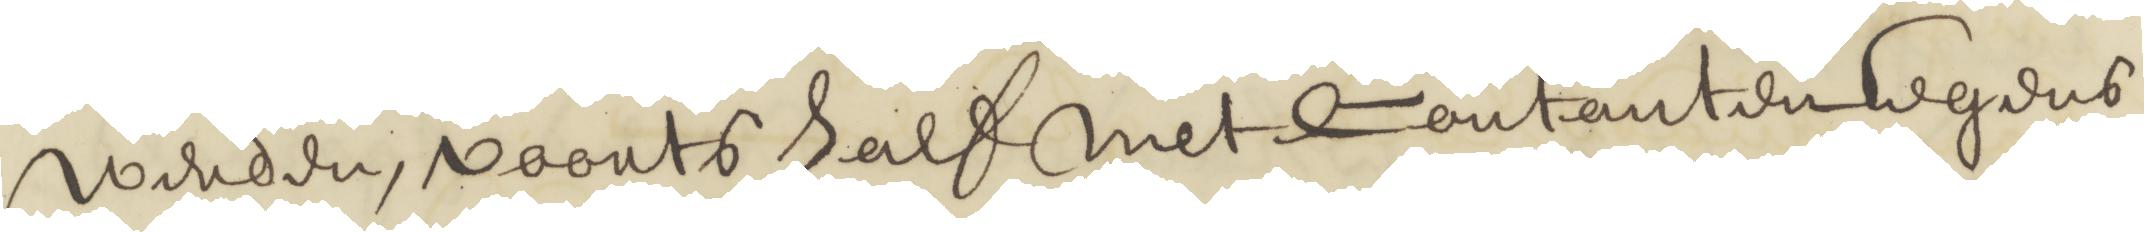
werden, voorts half met Contanten tegens
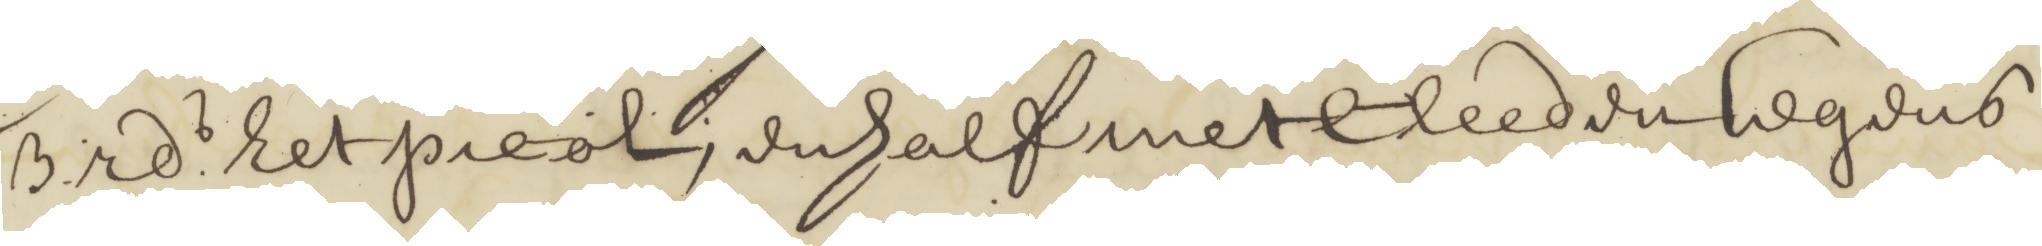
3 rd.s het picol; en half met Cleeden tegens
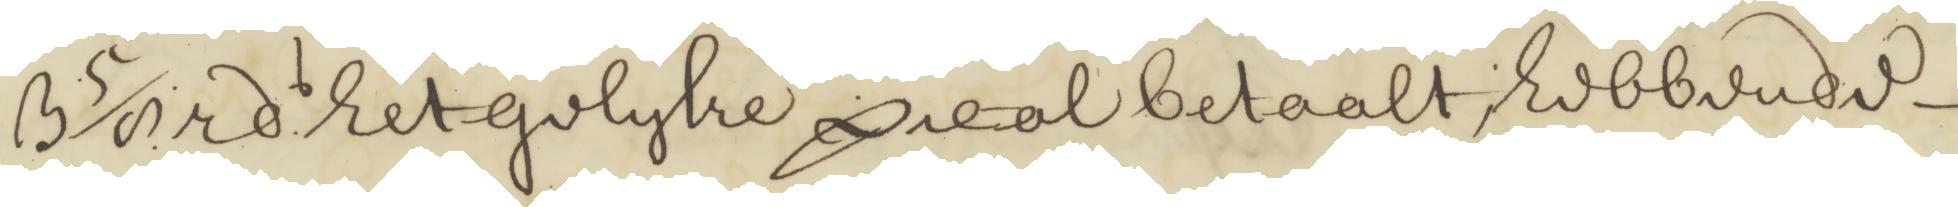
3 5/8 rd.s het gelyke picol betaalt, hebbende
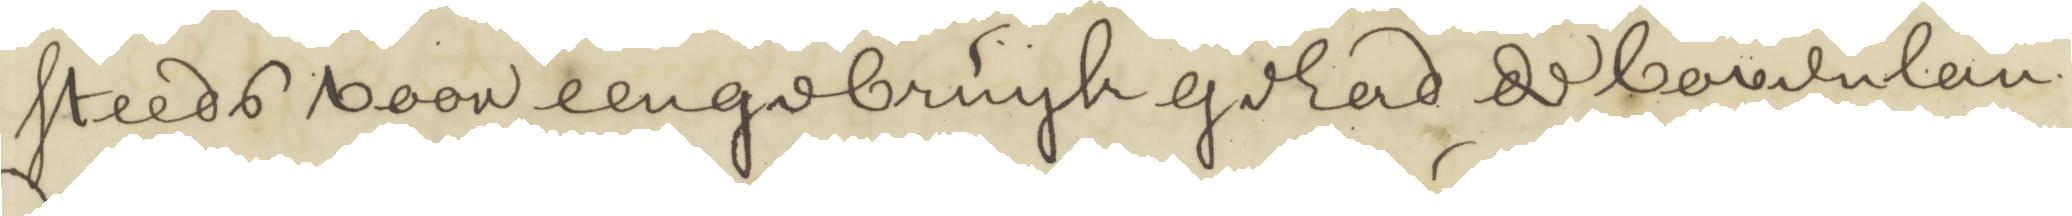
steeds voor een gebruijk gehad de bovenlan
